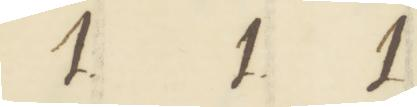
1. 1. 1
